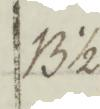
13½
